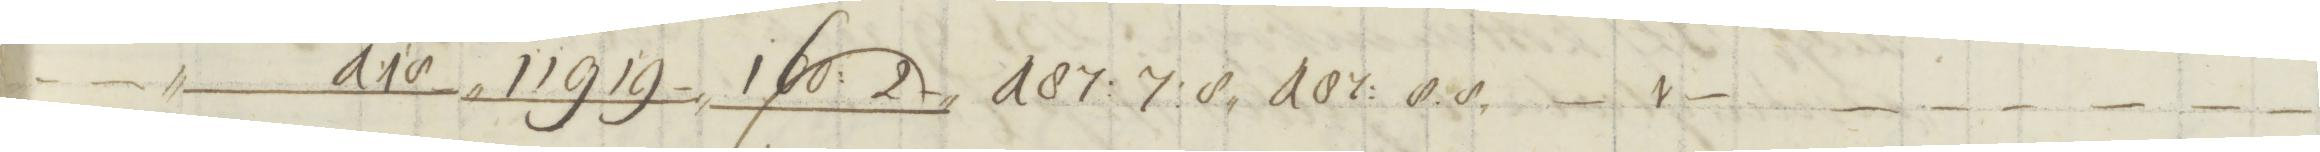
— —„ 4; 18 „ 11919-„ 160:2-„ 487: 7: 8„ 487: 8: 8. —1— — — — — — —
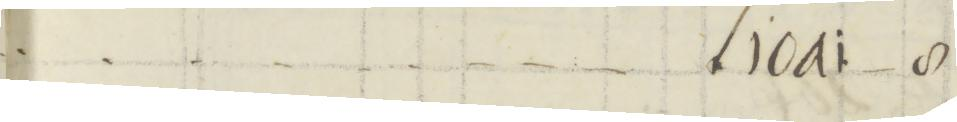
- - - - - - — — — ƒ104:— 8
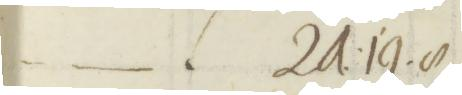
-- —ƒ24:19:8
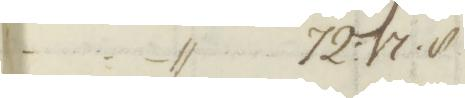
- - -„ 72:17.8
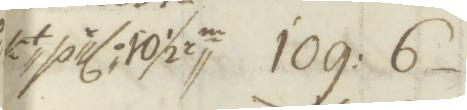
k„t p„r C„o 10½ r„m 109: 6—
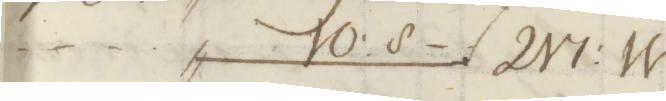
- - - . „ 10:8— ƒ217:11
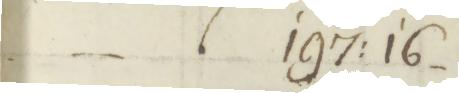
. -- ƒ197: 16—
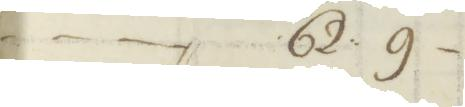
- ——-„ 62: 9—
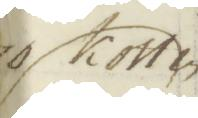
s Kosten
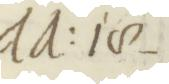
44:18—
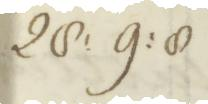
28: 9: 8
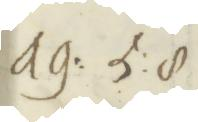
49: 5: 8
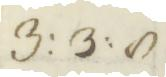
3: 3: 8
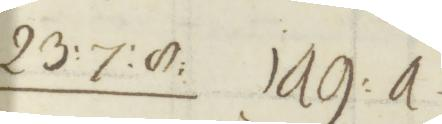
23:7:8: 149: 4
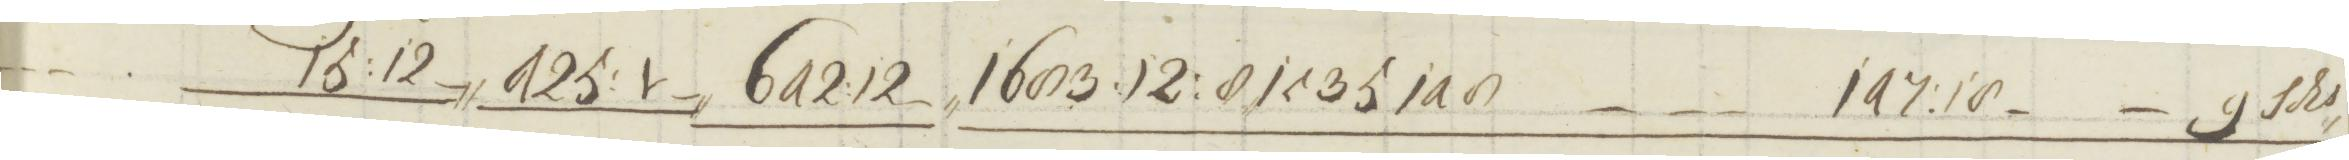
- - - . 15:12—„ 425:1—„ 642:12—„ 1683:12:81535 148 ———147:18— 9 schs„
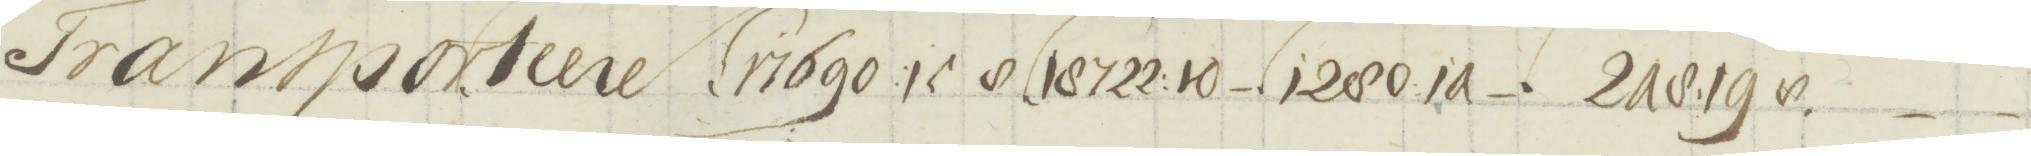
Transporteere ƒ17690:15 8 ƒ18722:10— ƒ1280:14— ƒ 248:19 8. — —
